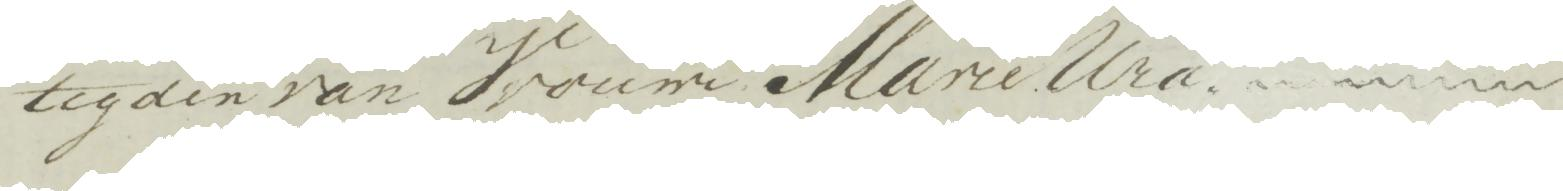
tigden van Vrouwe Marie Ura„ —
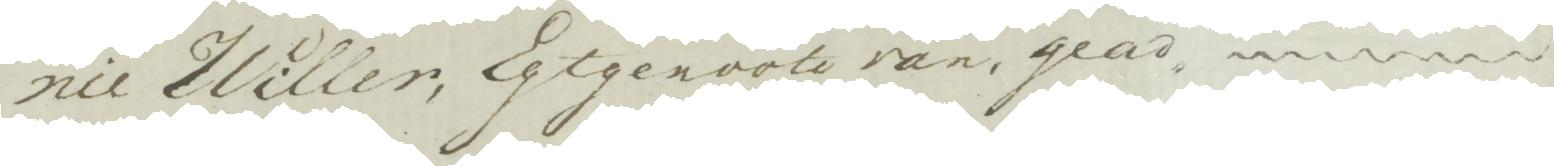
nie Willer, Egtgenoote van, gead
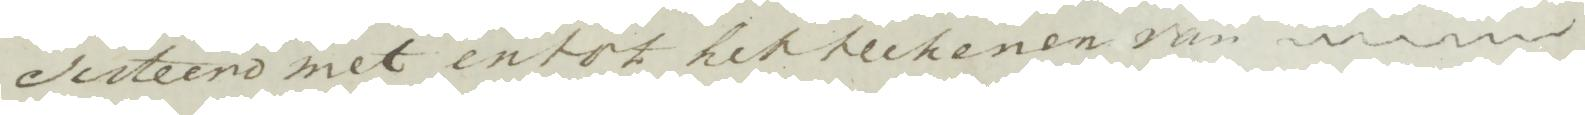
sisteerd met en tot het teekenen van
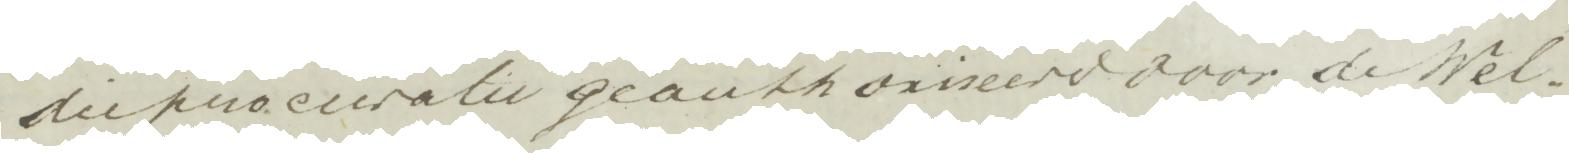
die procuratie geauthoriseerd door de Wel„
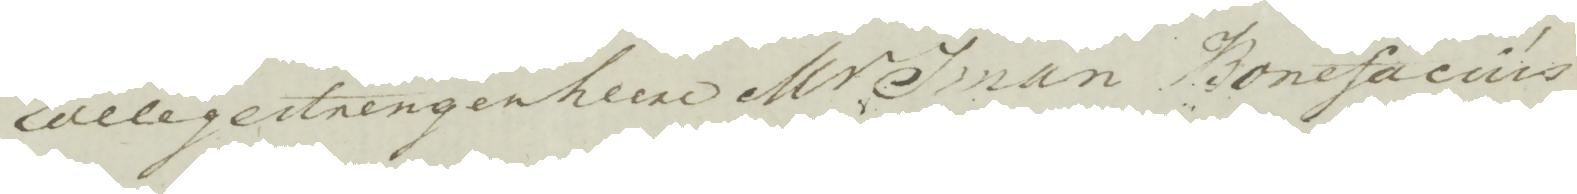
Edele gestrengen heere M,r Iman Bonefacius
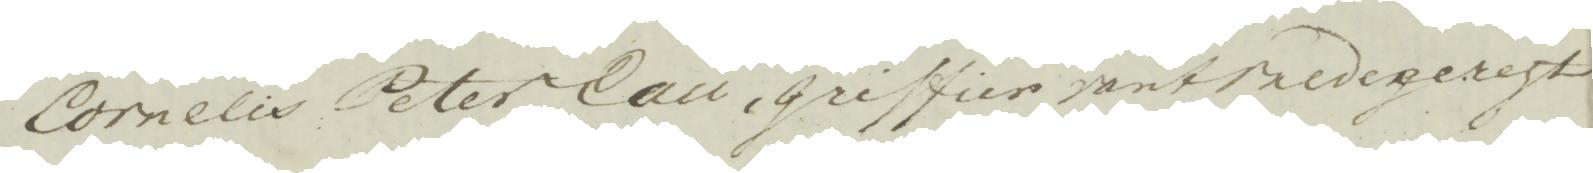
Cornelis Peter Cau, griffier van't vredegeregt
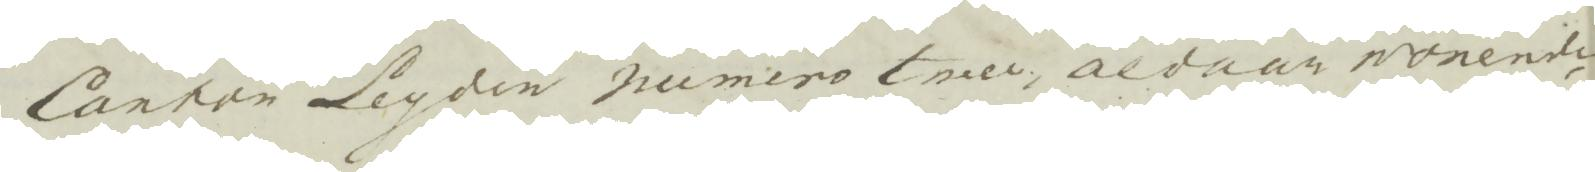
Canton Leyden numero twee, aldaar wonende
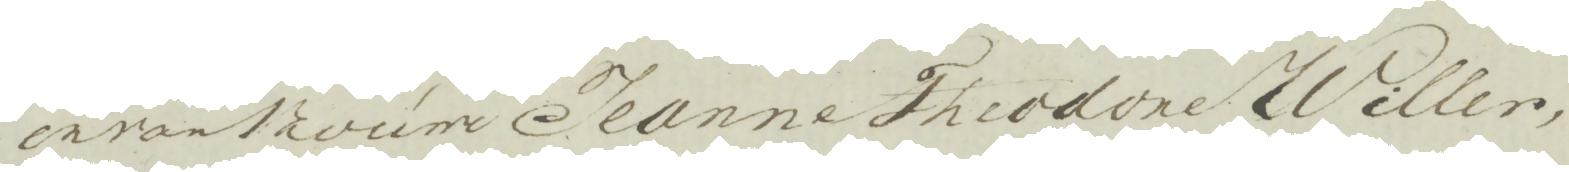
en van Vrouwe Jeanne Theodore Willer,
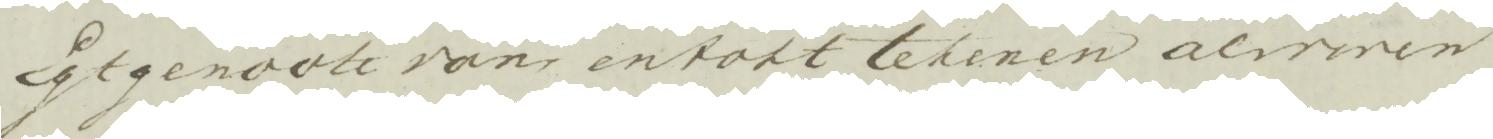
Egtgenoote van en tot 't tekenen als voren
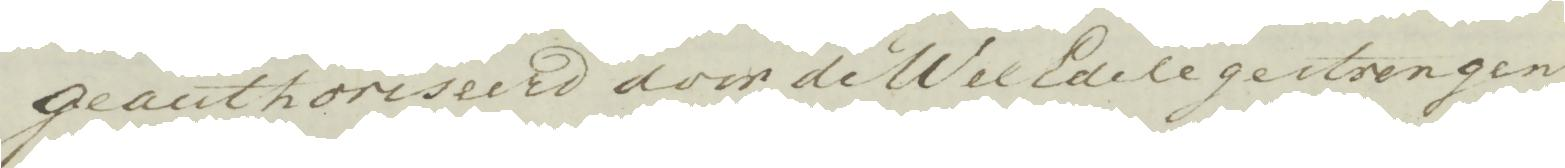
geauthoriseerd door de Wel Edele gestrengen
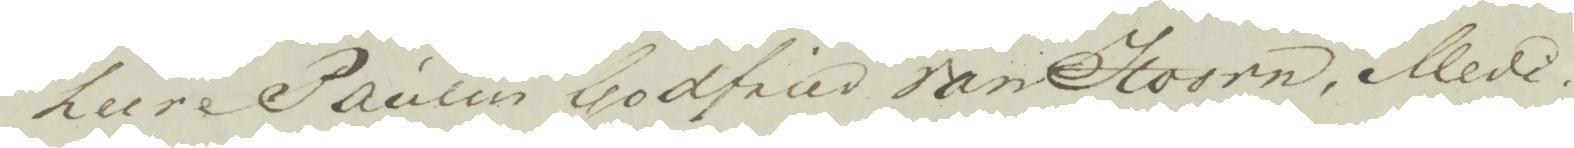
heere Paulus Godfried van Hoorn, Medi,
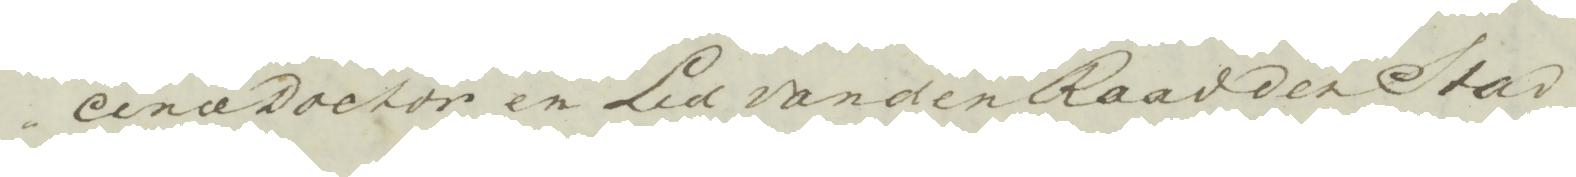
„cinae Doctor en Lid van den Raad der Stad
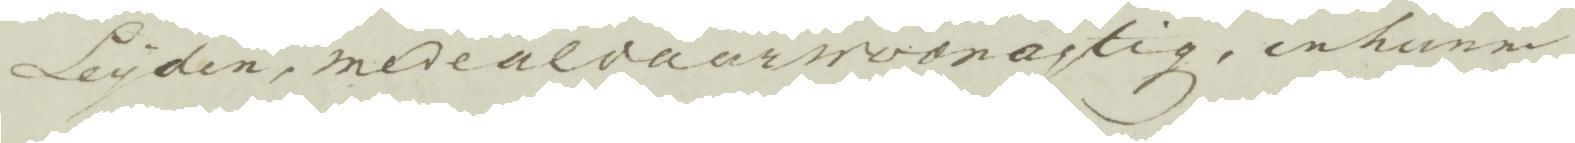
Leijden, mede aldaar woonagtig, in hunne
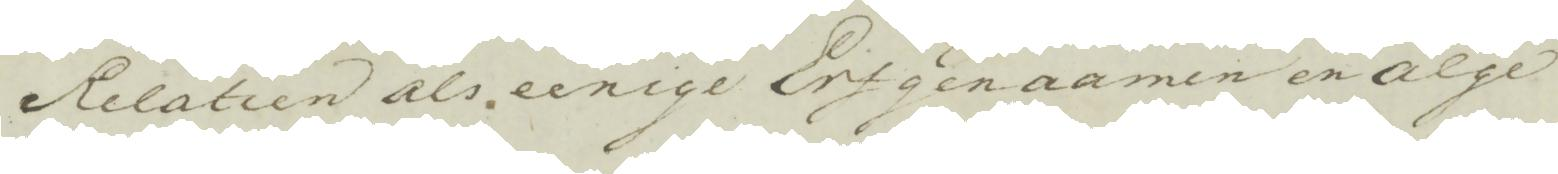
Relatien als eenige Erfgenaamen en alge
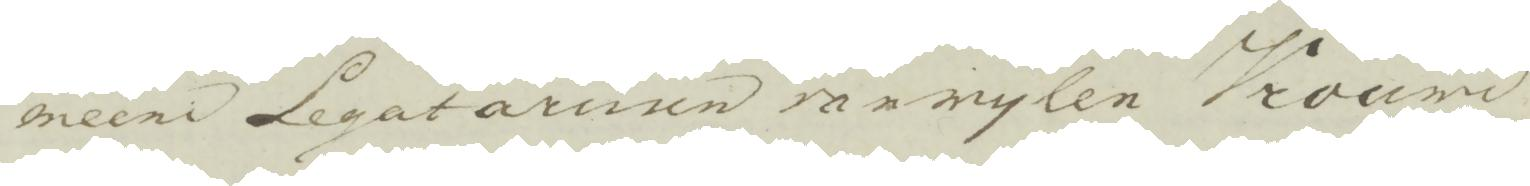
meene Legatarissen van wylen Vrouwe
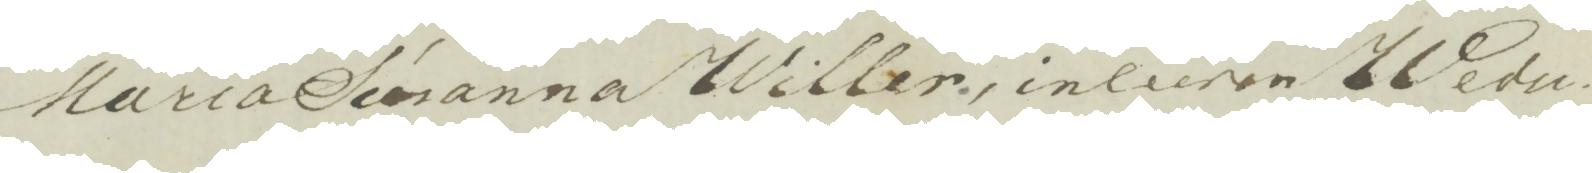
Maria Susanna Willer, in leeven Wedu-
